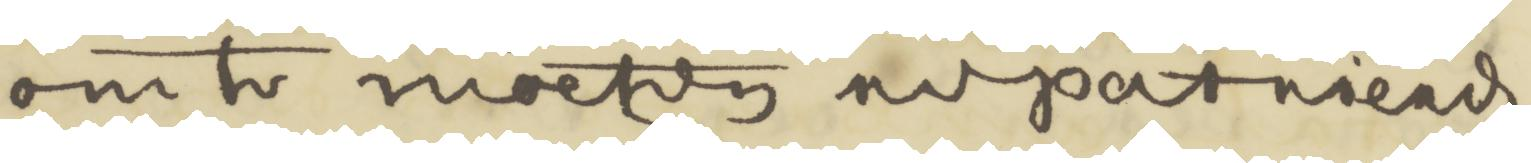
om te moeten repatrieren
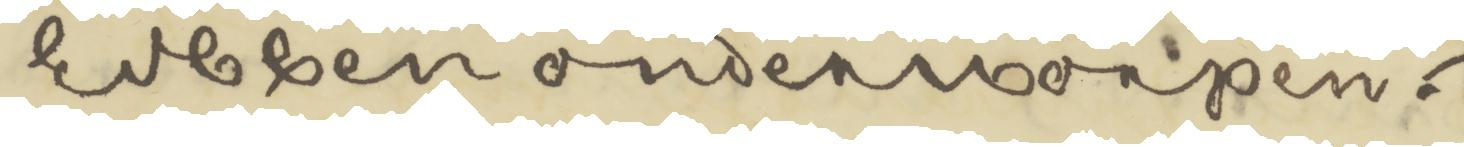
hebben onder worpen.
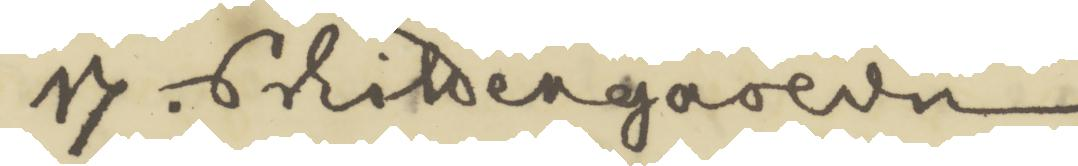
17. schildergasten
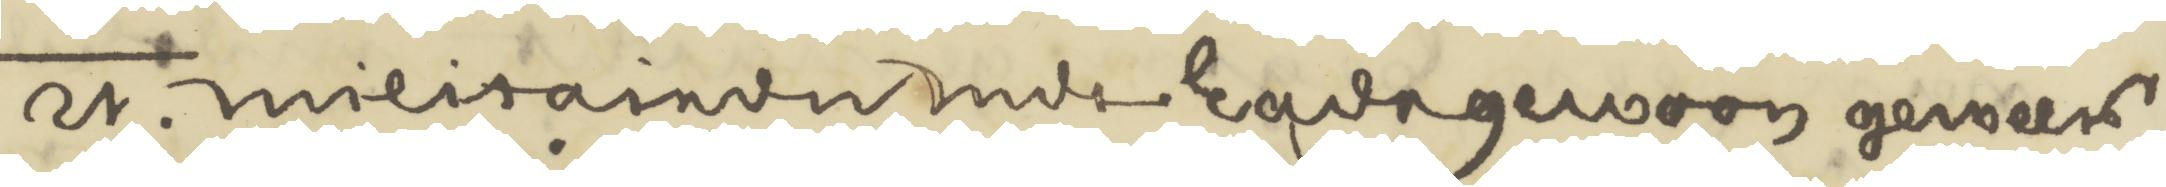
21. militairen met haergewoon geweers
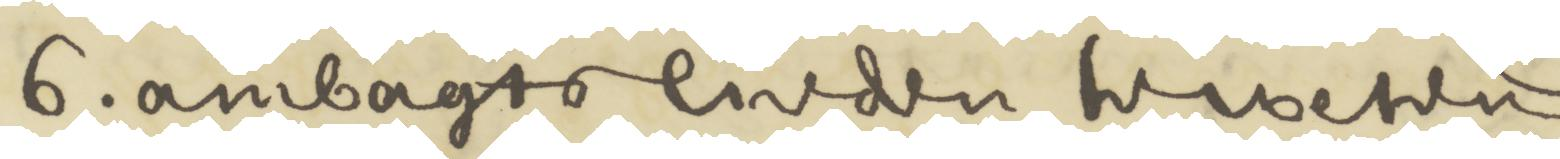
6. ambagts lieden te weten
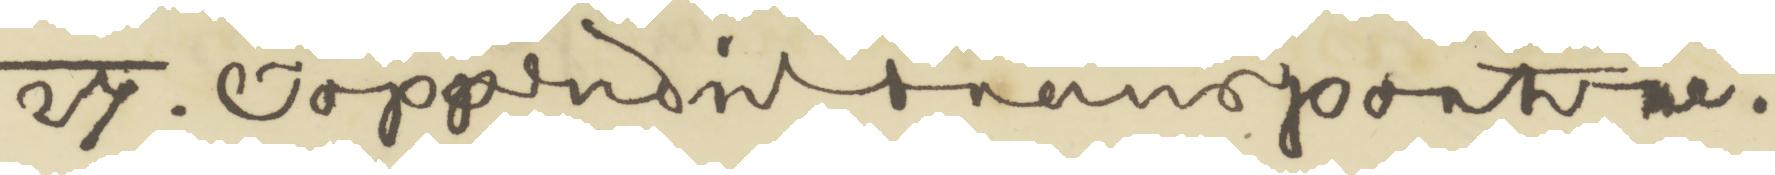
27. Coppendie transportere.
